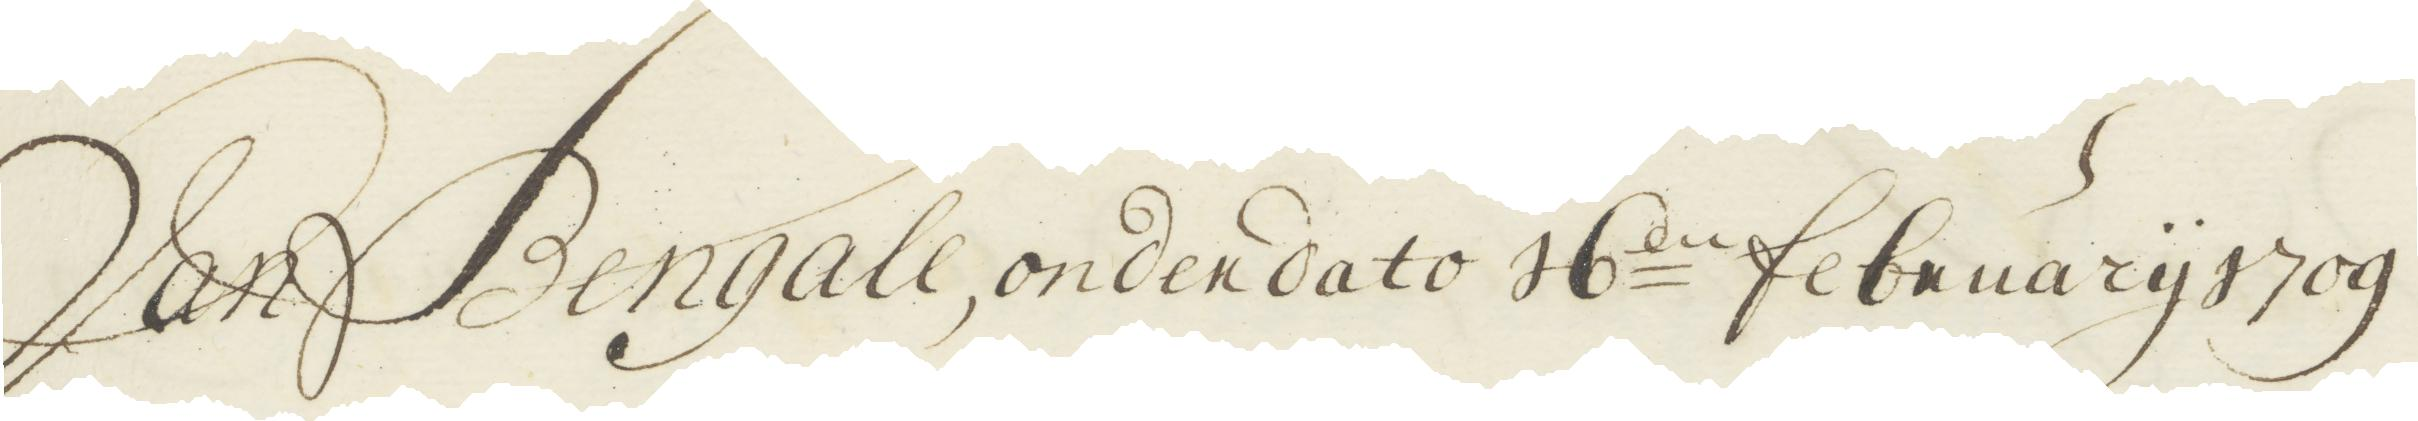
Van Bengale, onder dato 16=en februarij 1709
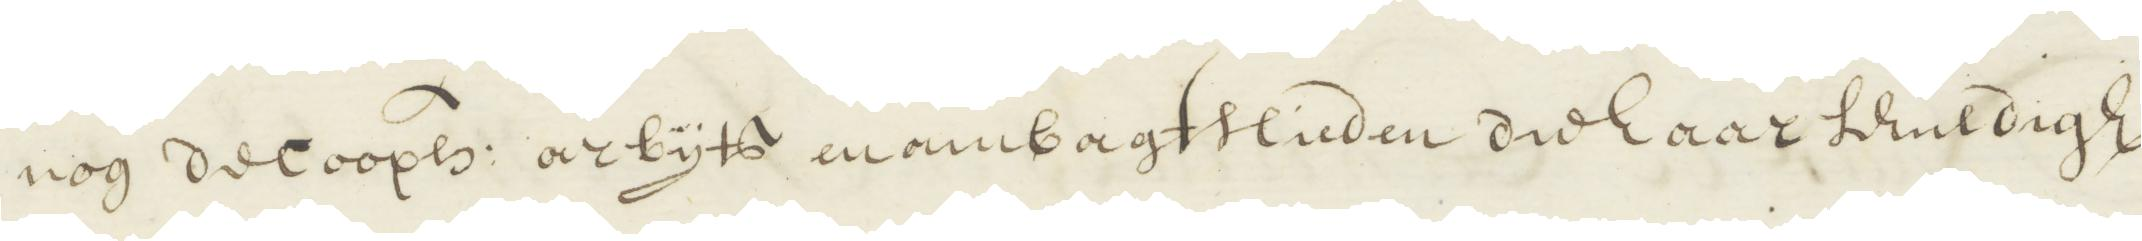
nog de coopl: arbijts en ambagtslieden die haar schuldigh
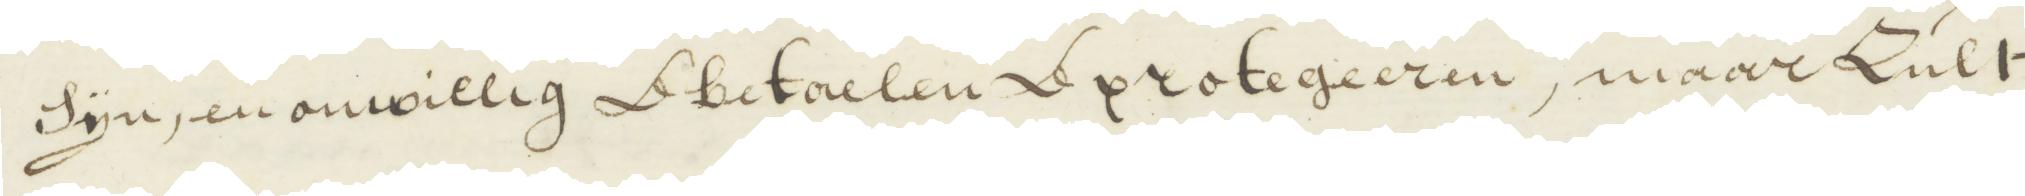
sijn, en onwillig te betaelen te protegeeren, maar zult
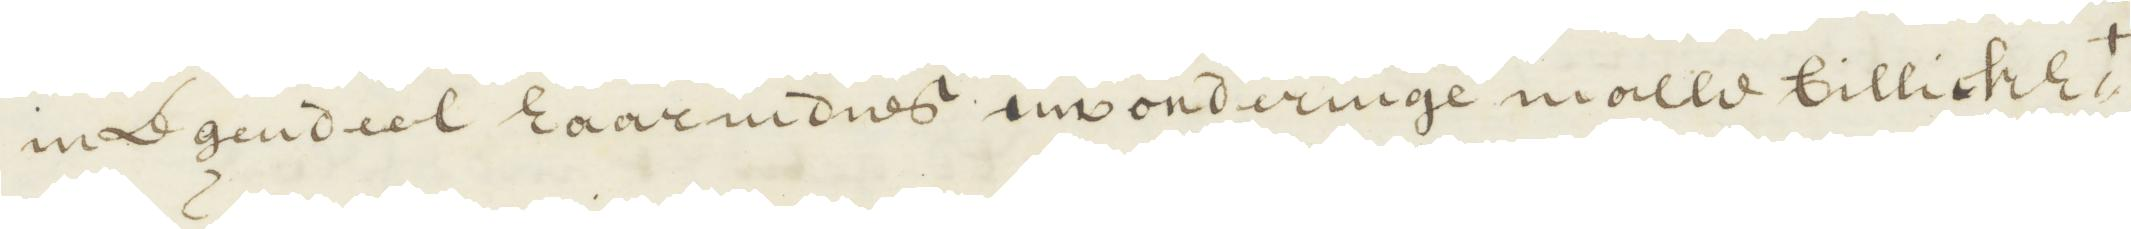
in te gendeel haar in dies invorderinge malle billickh„t
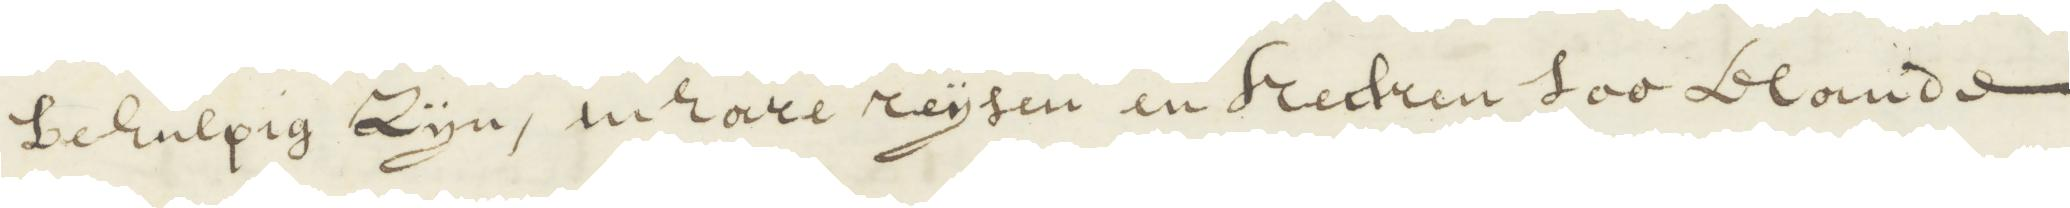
behulpig zijn, in hare reijsen en trecken soo te lande
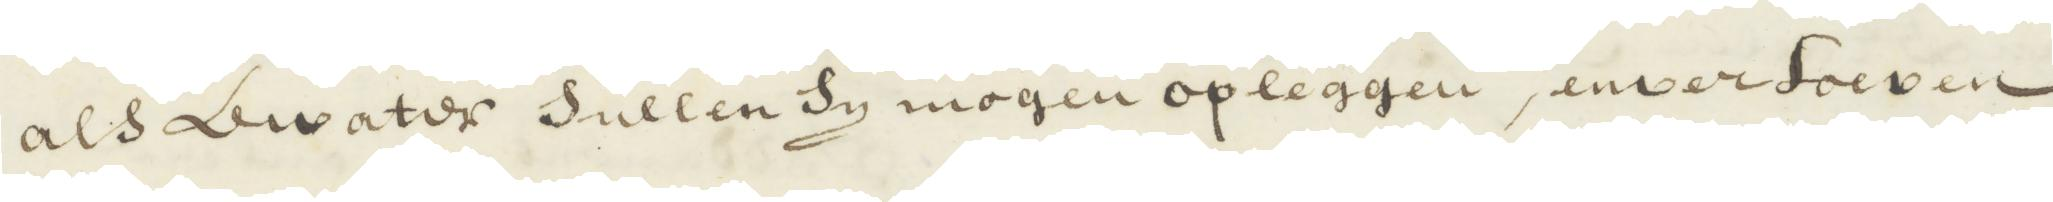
als te water sullen sy mogen op leggen, en vertoeven
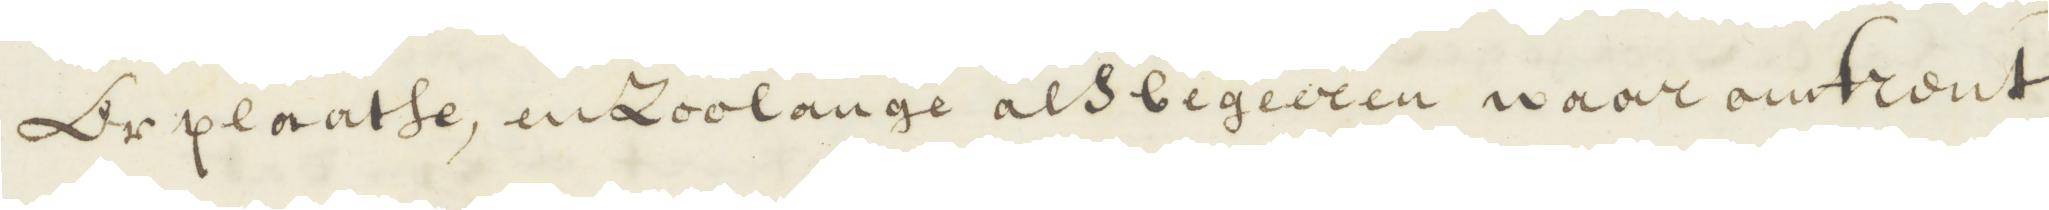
ter plaatse, en zoolange als begeeren waar omtrent
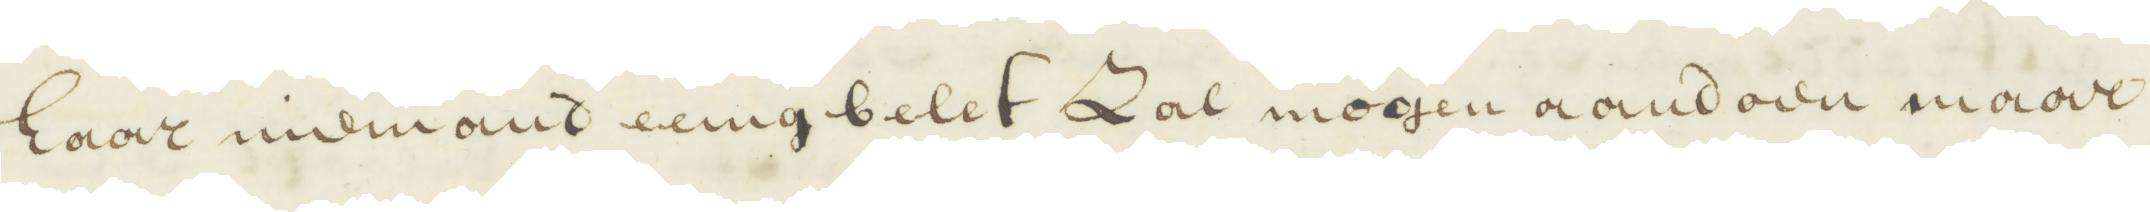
haar niemand eenig belet zal mogen aandoen maar
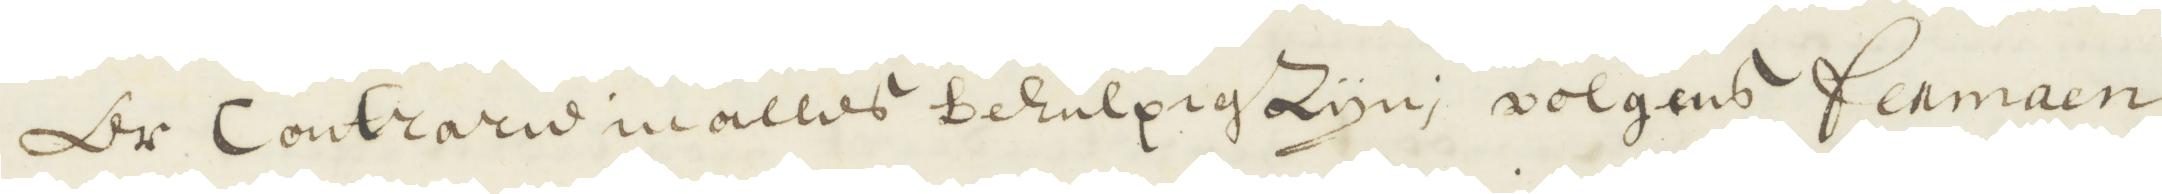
ter Contrarie in alles behulpig zijn; volgens fermaen
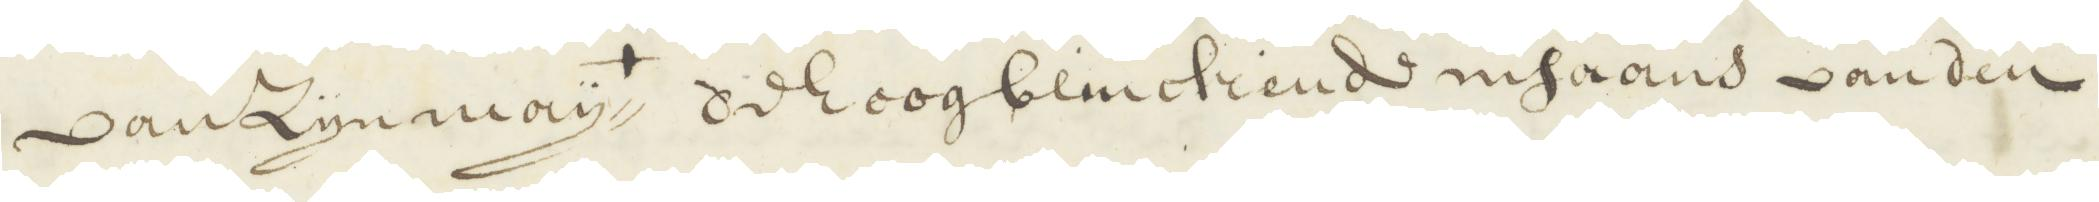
van zijn maij„t de hoog blinckende nisaans van den
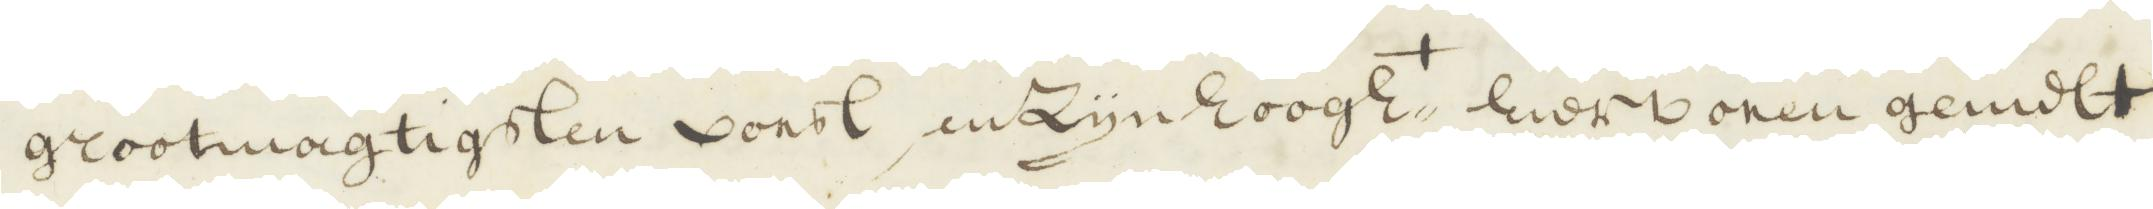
grootmagtigsten vorst, en zijn hoogh„t hier voren gemelt
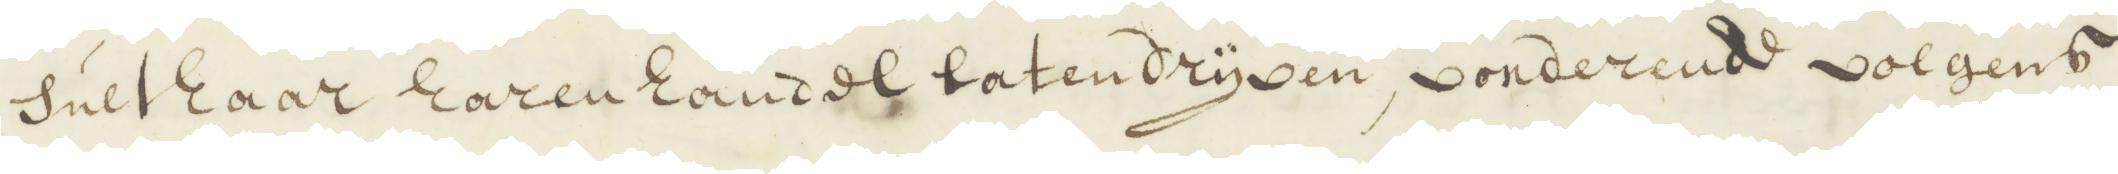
sult haar haren handel laten drijven, vorderende volgens
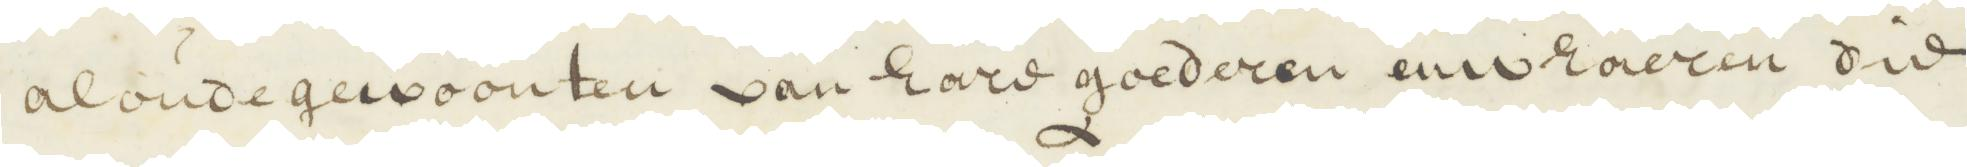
al oude gewoonten van hare goederen en whaeren die
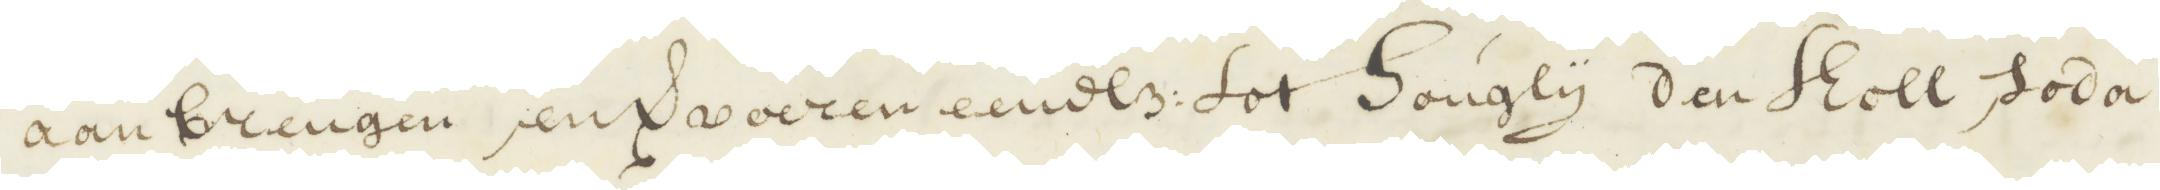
aan brengen, en vervoeren eenelijk: tot Houglij den tholl, soda
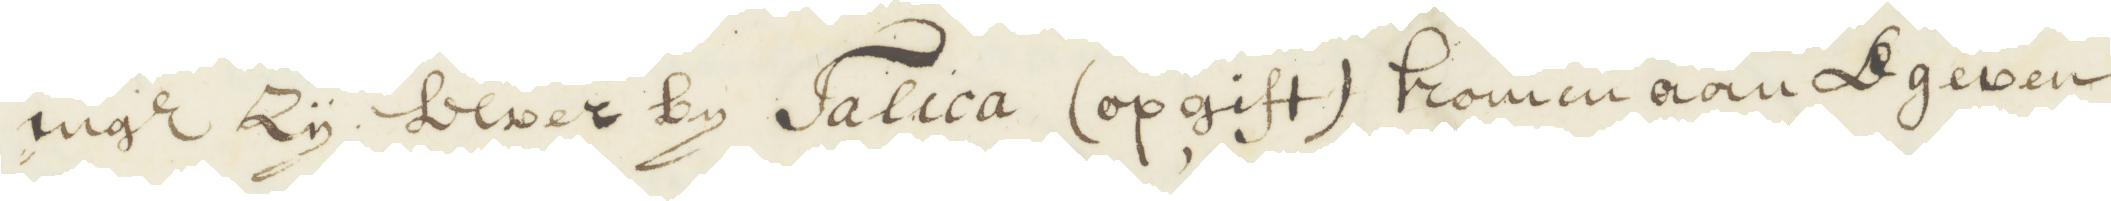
„nigh zij . selver bij Talica (op gift) komen aan te geven
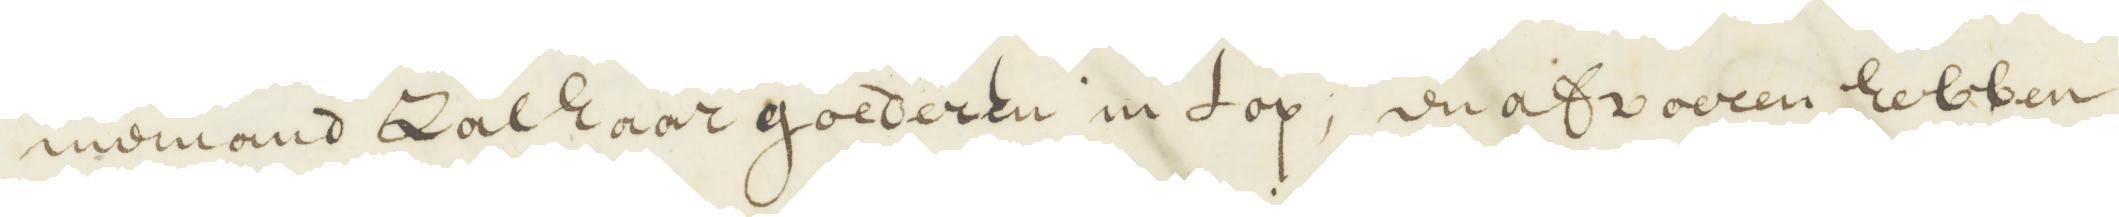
niemand zal haar goederen in 't op; en afvoeren hebben
